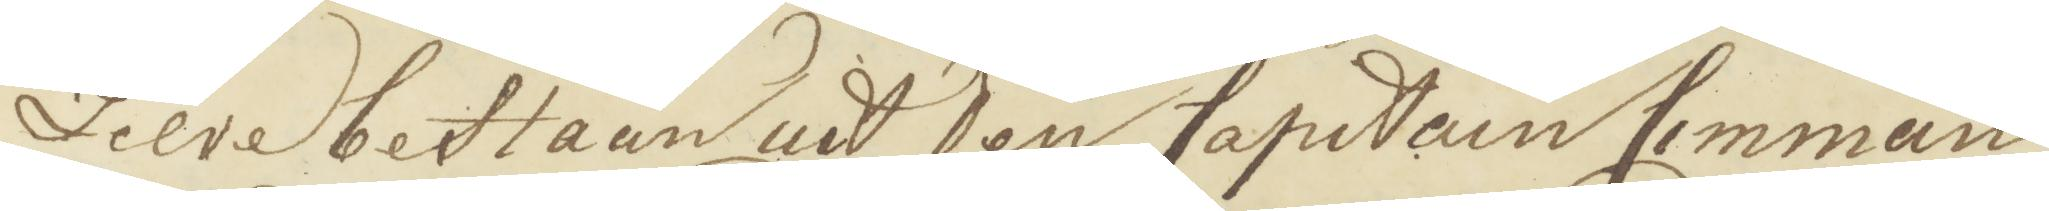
Zelve bestaan uit den Capitain Comman
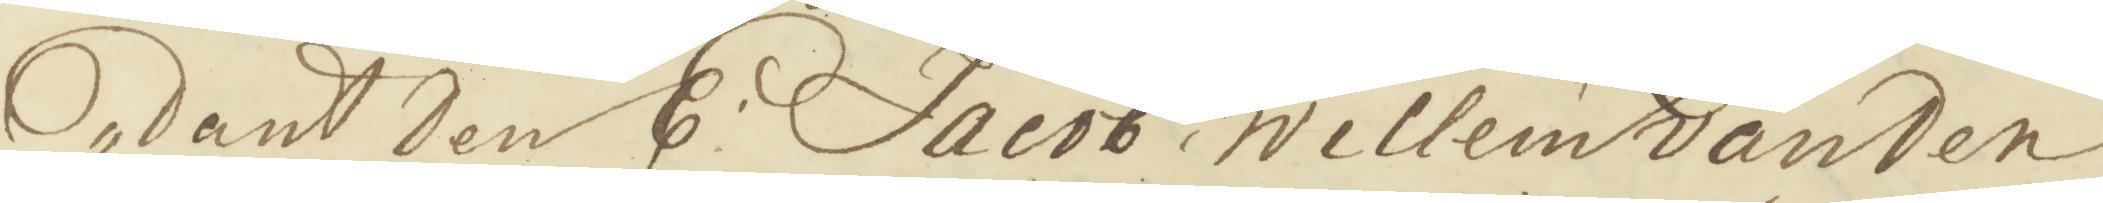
dant den E: Jacob Willem van der
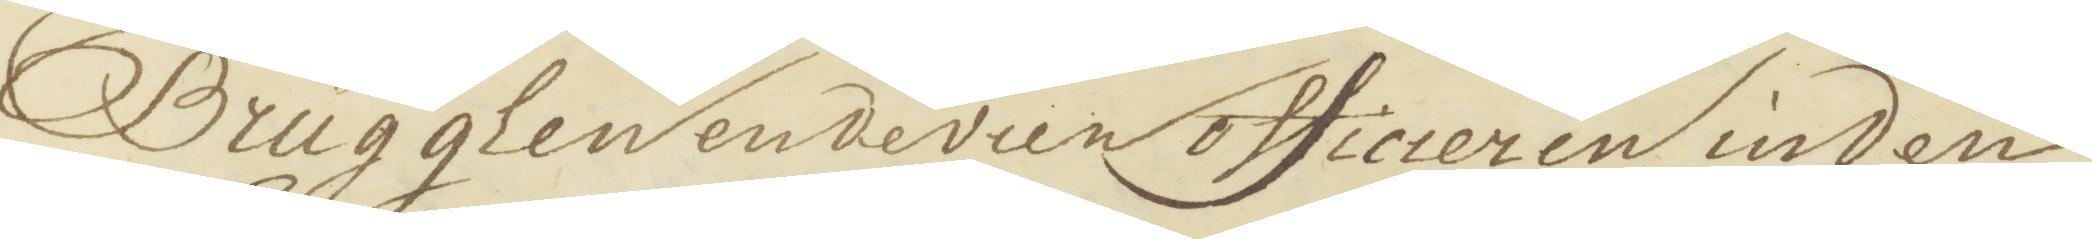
Brugghen en de vier officieren in den
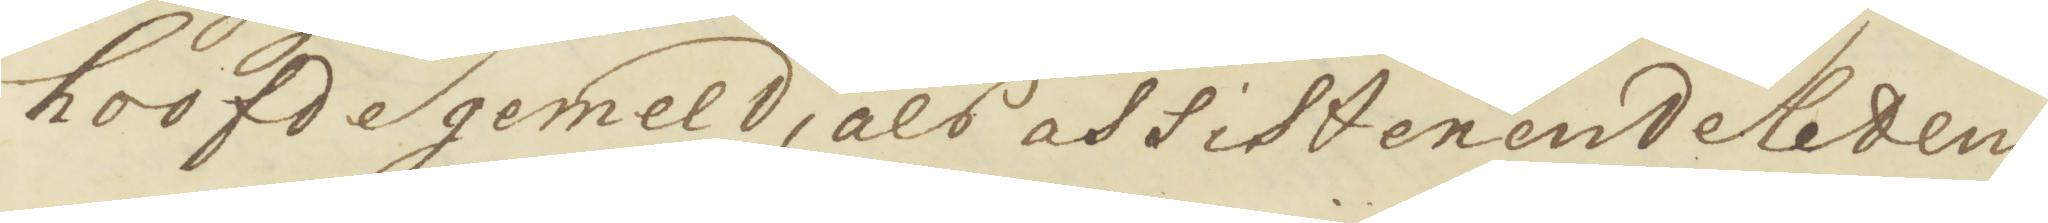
hoofde gemeld, als assisterende leden
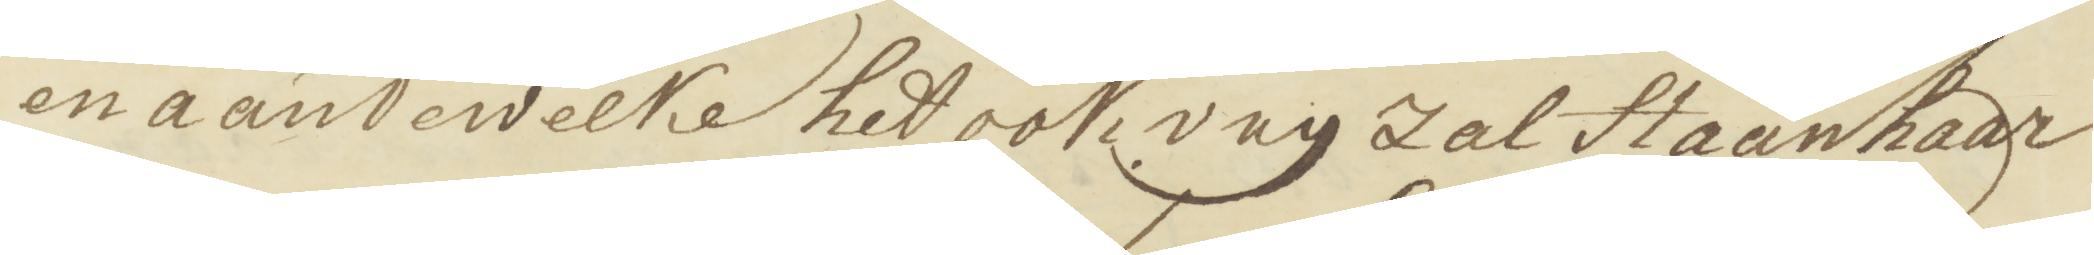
en aan dewelke het ook vrij zal staan haar
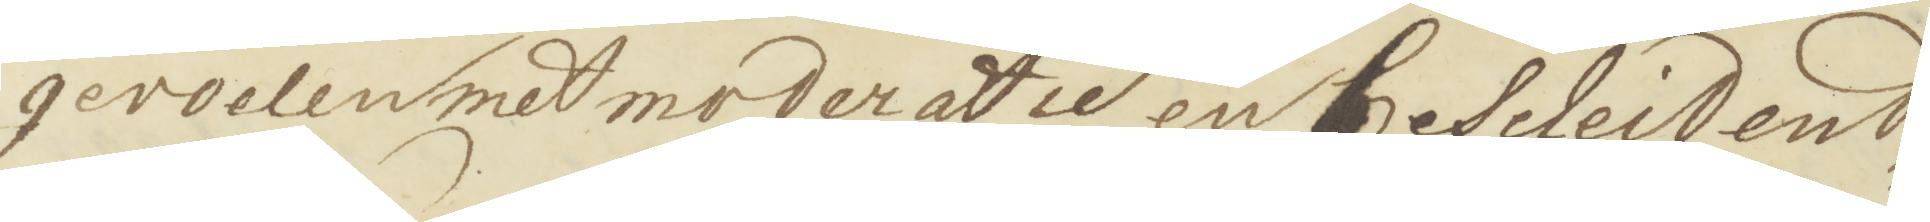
gevoelen met moderatie en bescheidend„
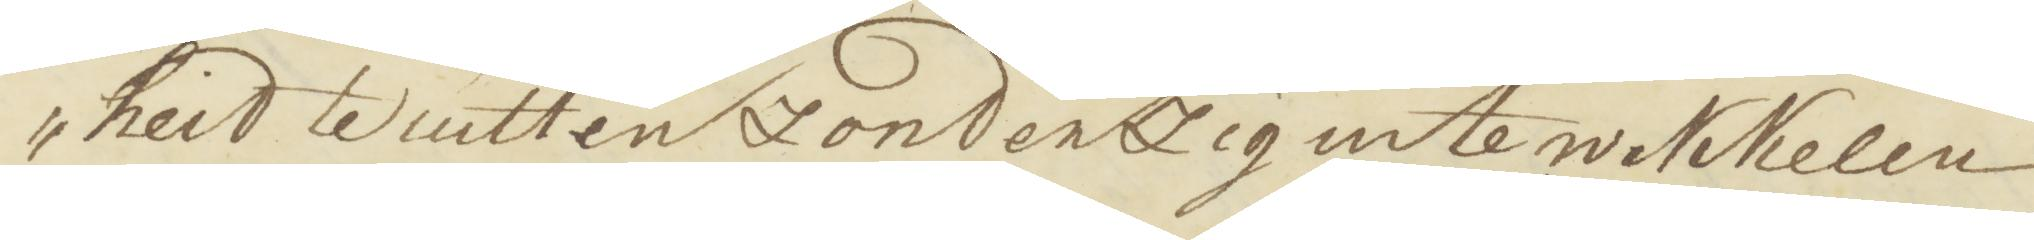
„heid te uitten zonder zig in te wikkelen
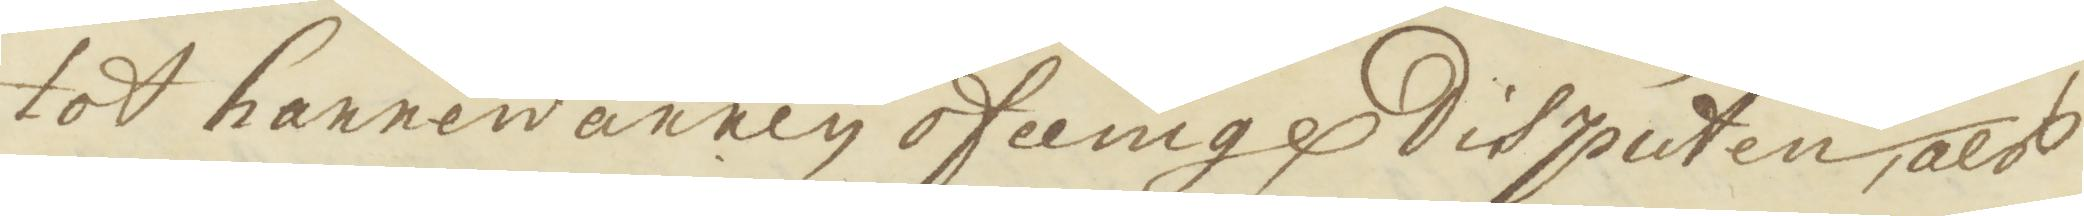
tot harrewarren of eenige disputen, als
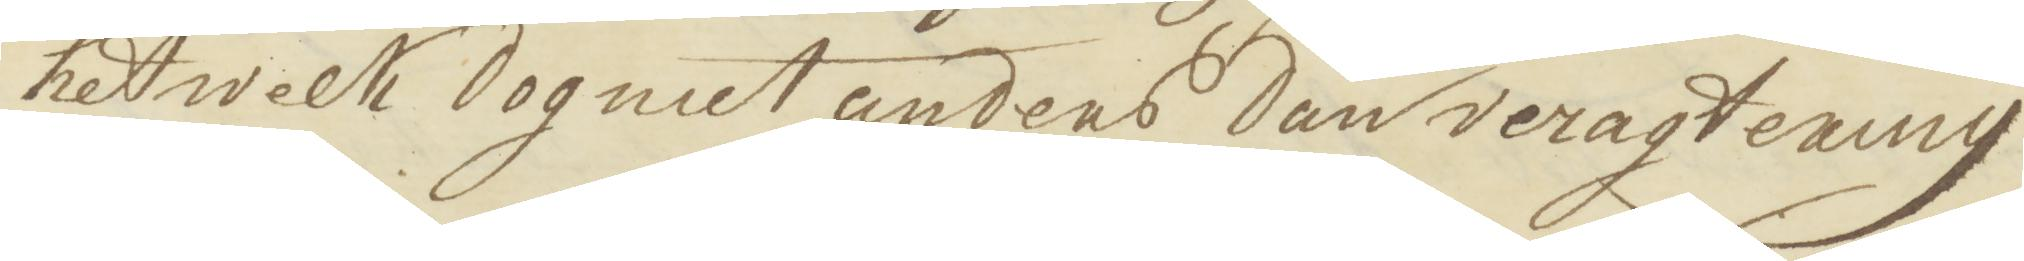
het welk dog niet anders dan veragtering
